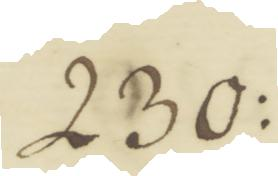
230:
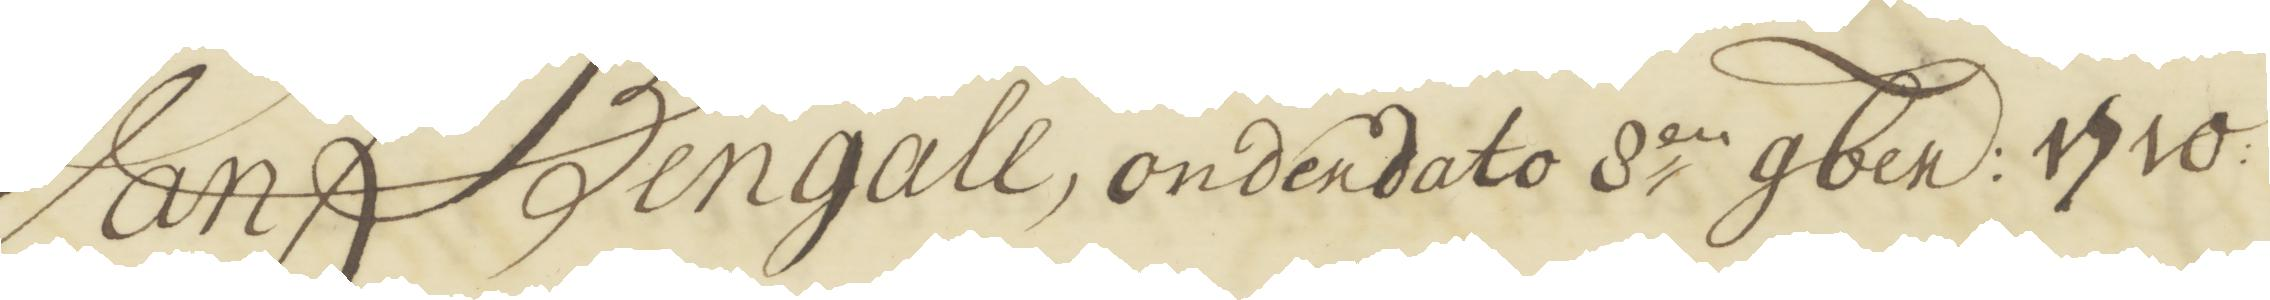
Van Bengale, onderdato 8„en gber: 1710:
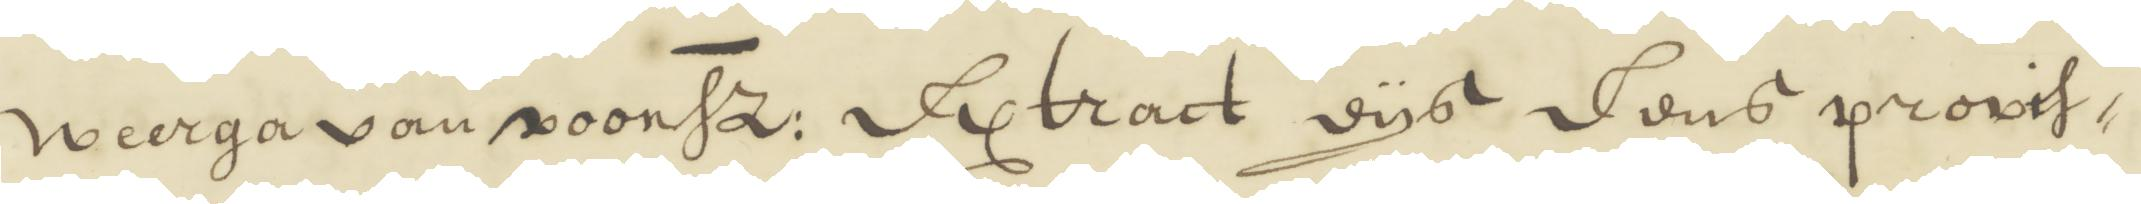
weerga van voorsz: Extract eijs Eens provis„l
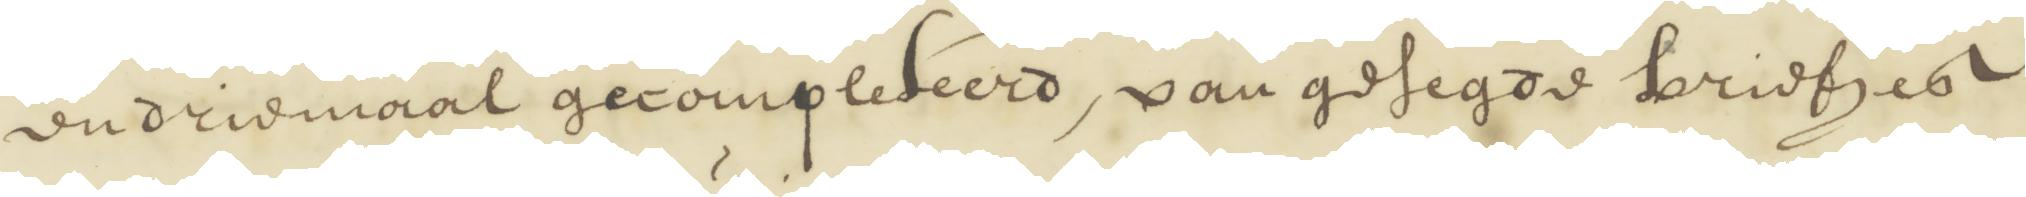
en driemaal gecompleteerd, van gesegde briefjes
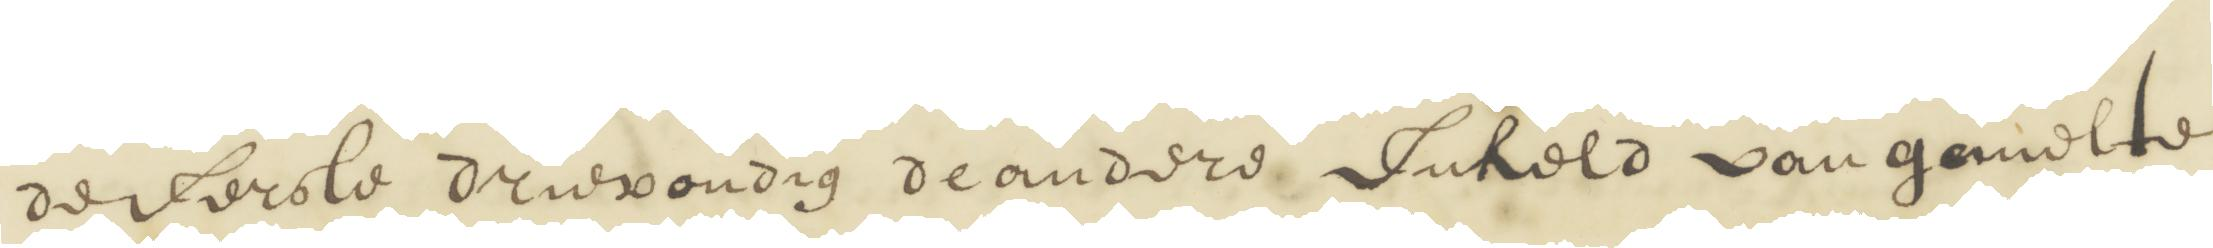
de Eerste drievoudig de andere Enheld van gemelte
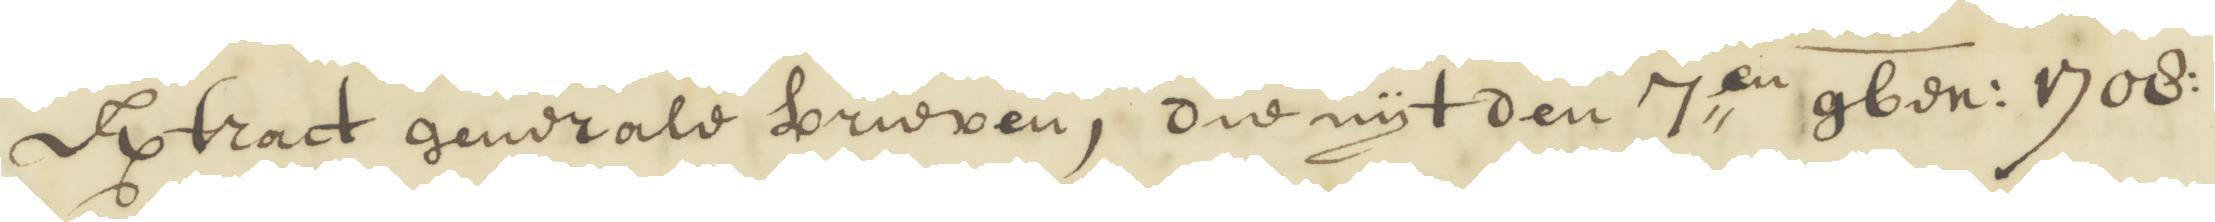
Extract generale brieven, die uijt den 7„en gber: 1708:
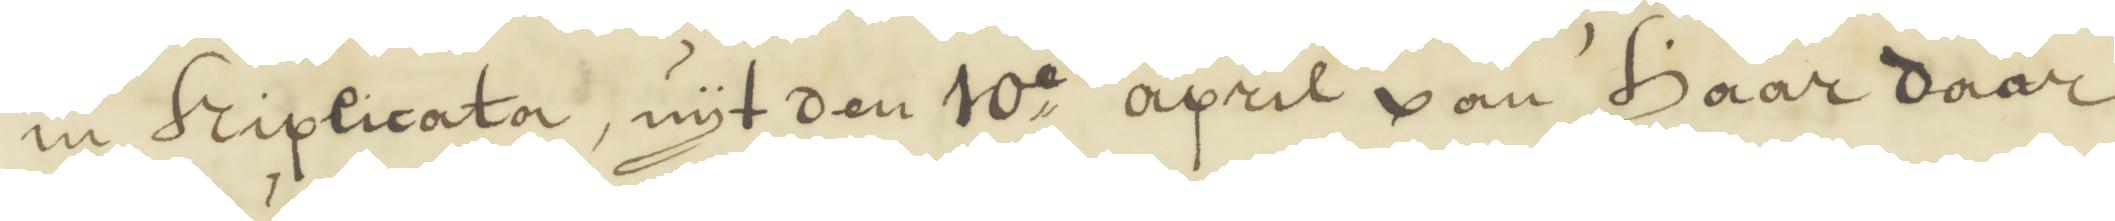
in triplicata, uijt den 10„e april van 'tjaar daar
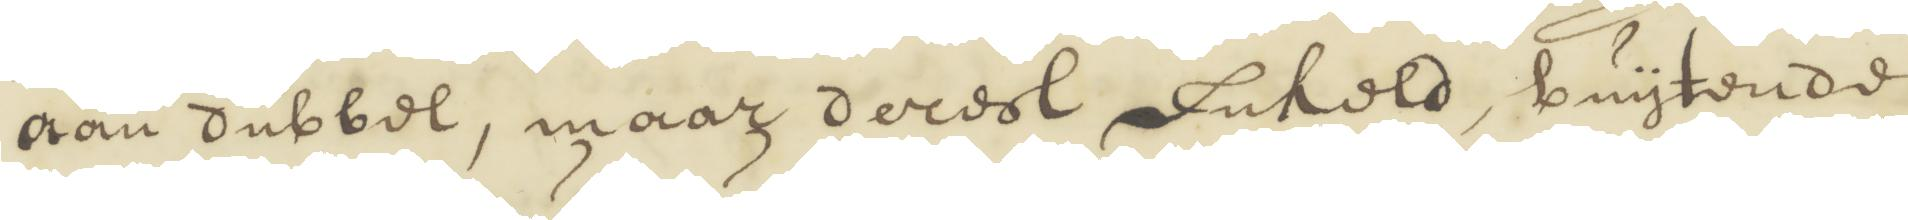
aan dubbel, maar derest Enkeld, buijten de
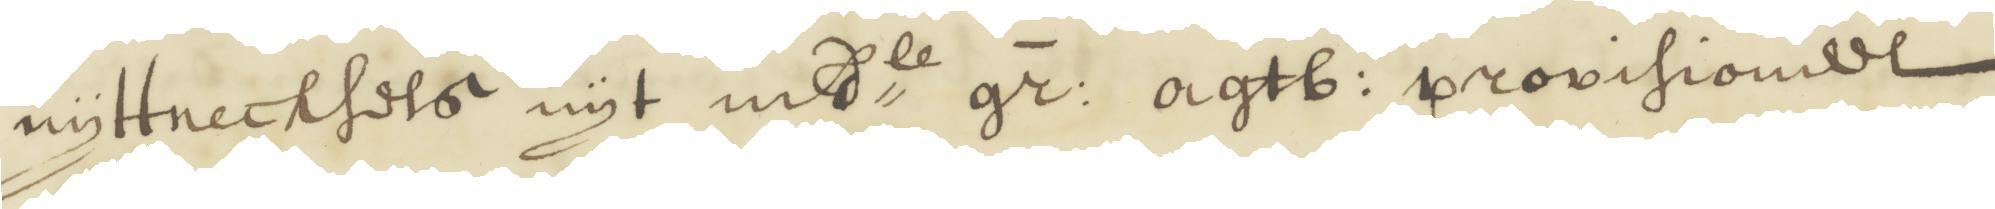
uijttrecksels uijt uEd„le gr: agtb: provisioneel,
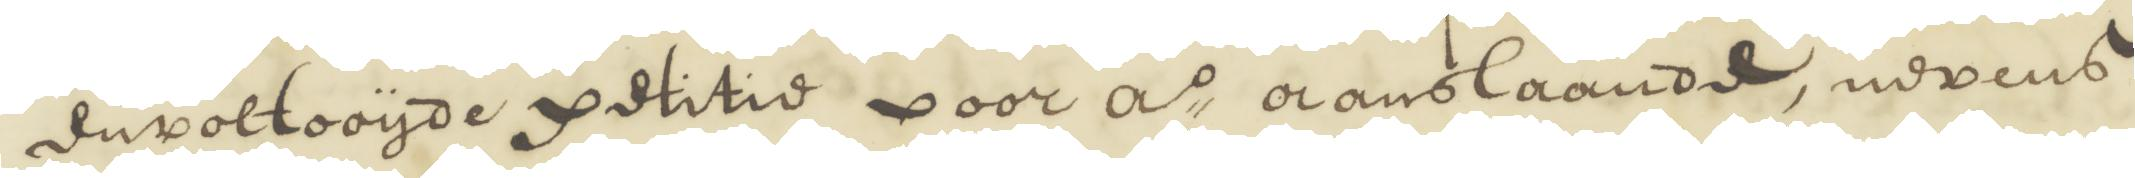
en voltooijde petitie voor a„o aanstaande, nevens
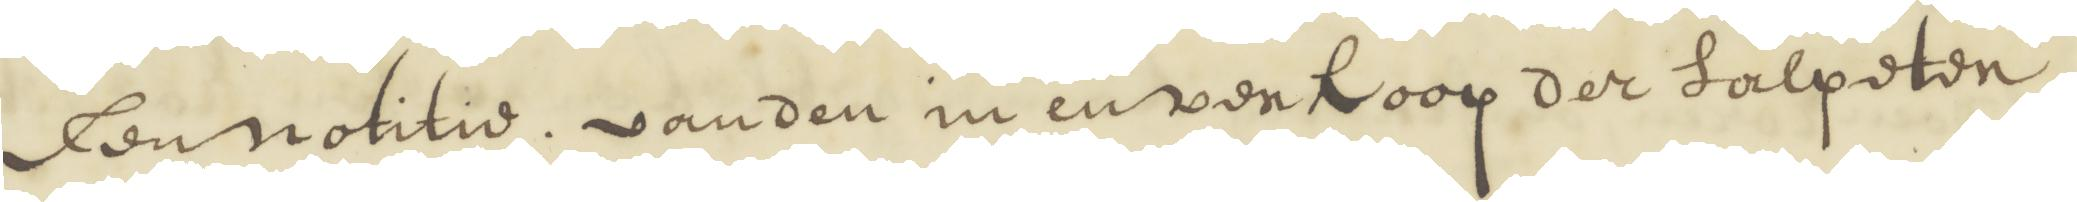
Een notitie. van den in en verkoop der salpeter,
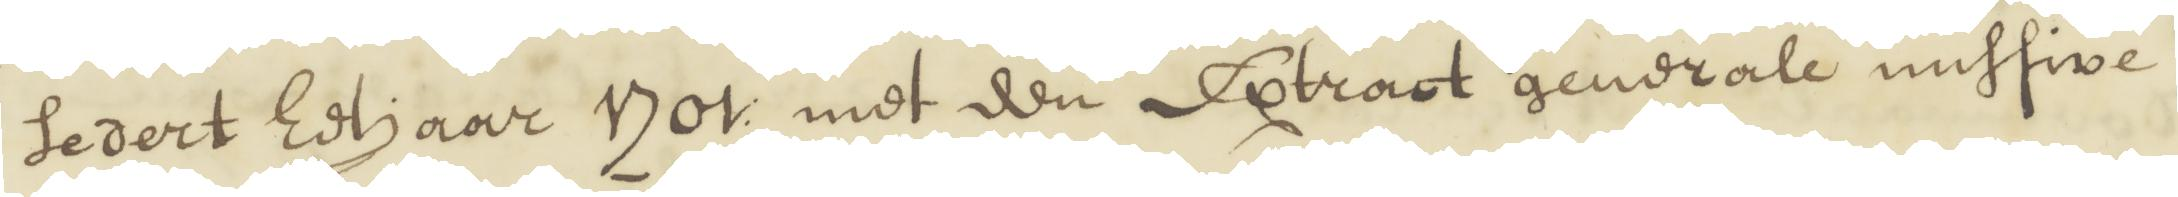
sedert het jaar 1701. met een Extract generale missive
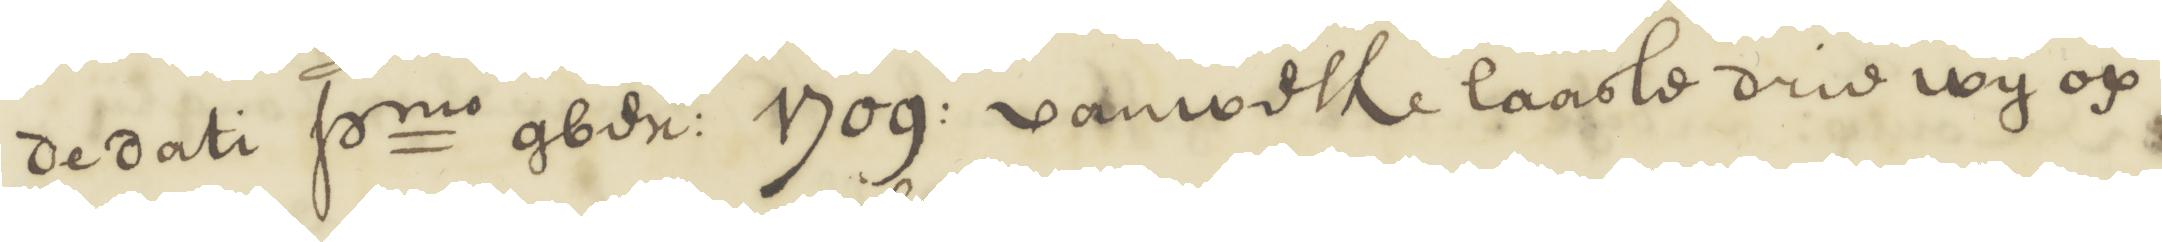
de dati p=mo gber: 1709: van welke laaste drie wij op
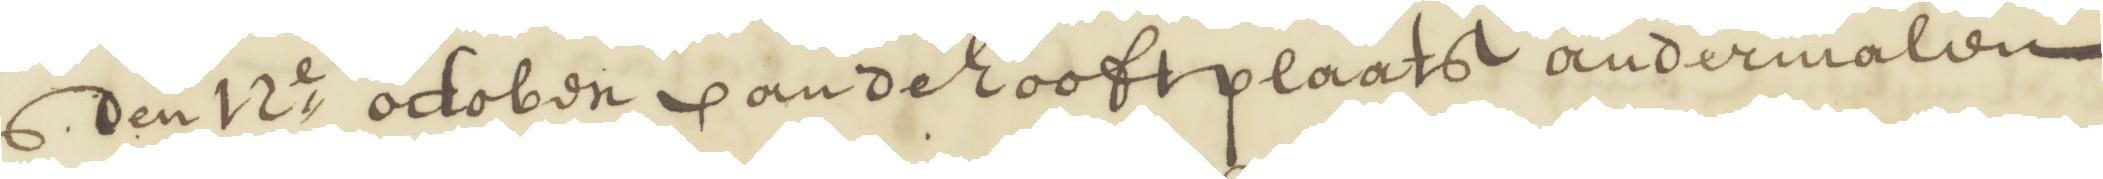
den 12„e october van de hooftplaats andermalen
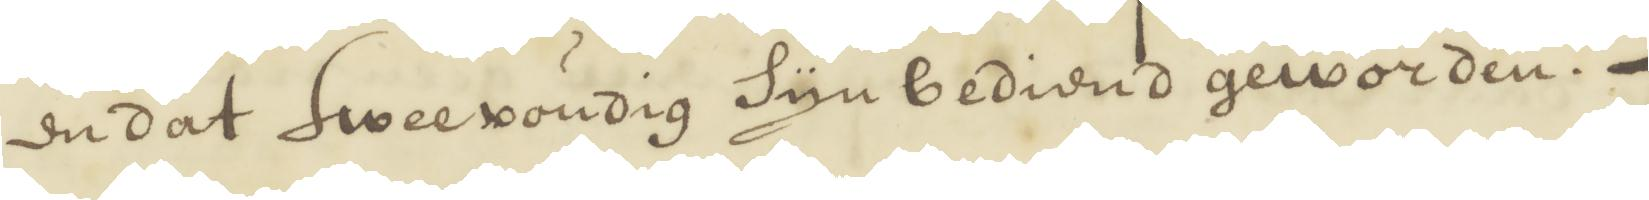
en dat tweevoudig sijn bediend geworden. -
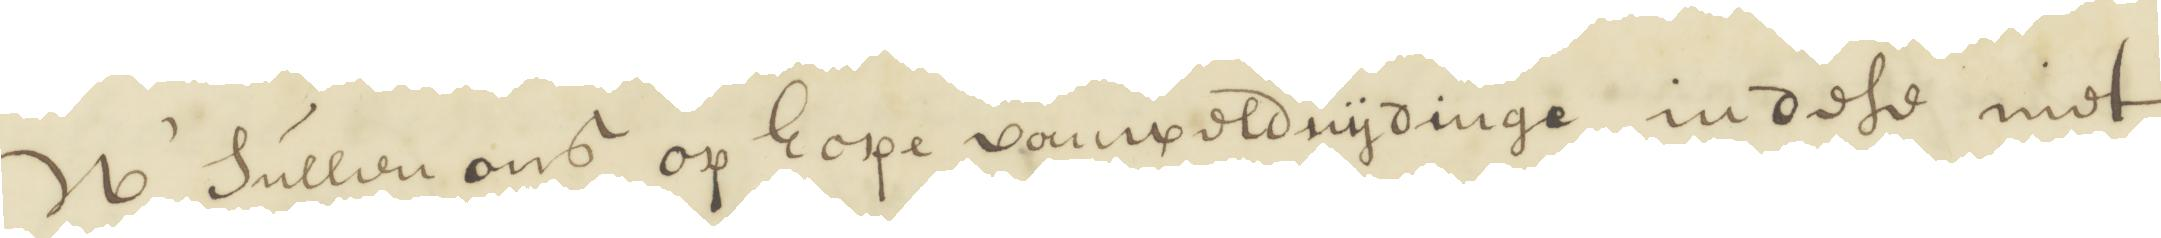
W' sullen ons op hope van welduijdinge in dese niet
